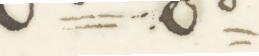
d=o d=o
